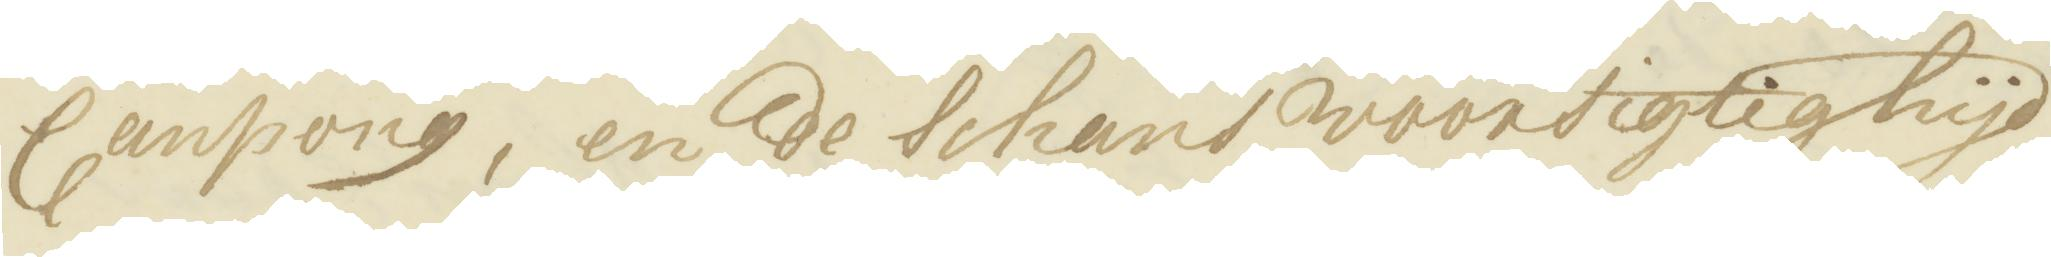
Canpong, en de schans voorsigtighijd
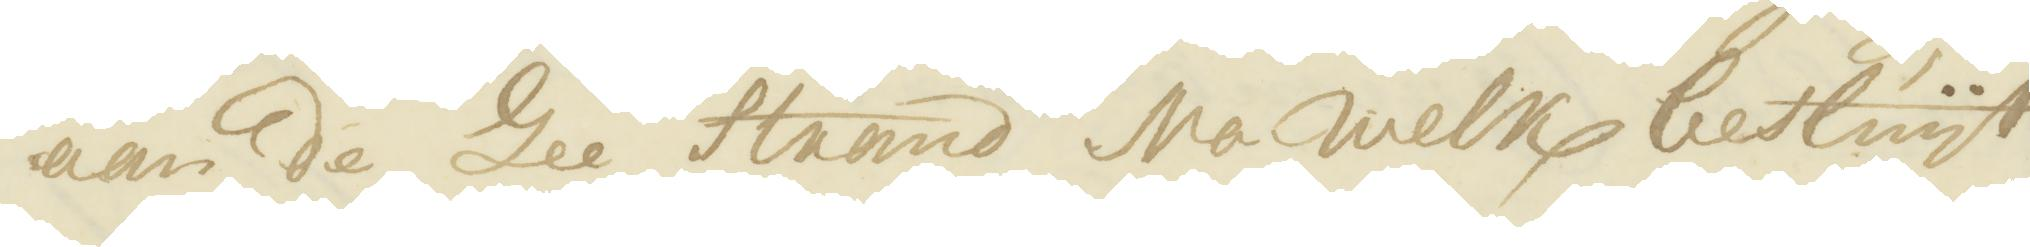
aan de zee strand Na welk besluijt
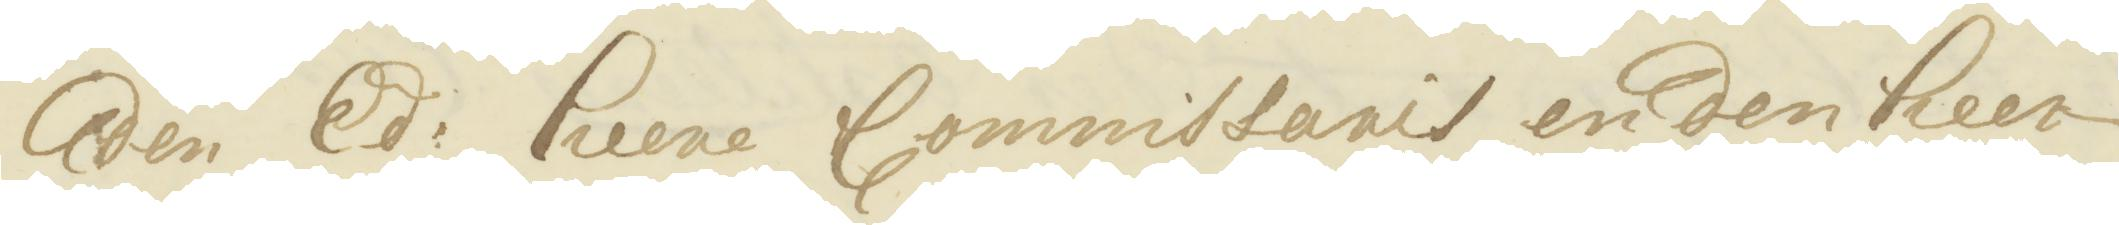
den Ed: heere Commissaris en den heer
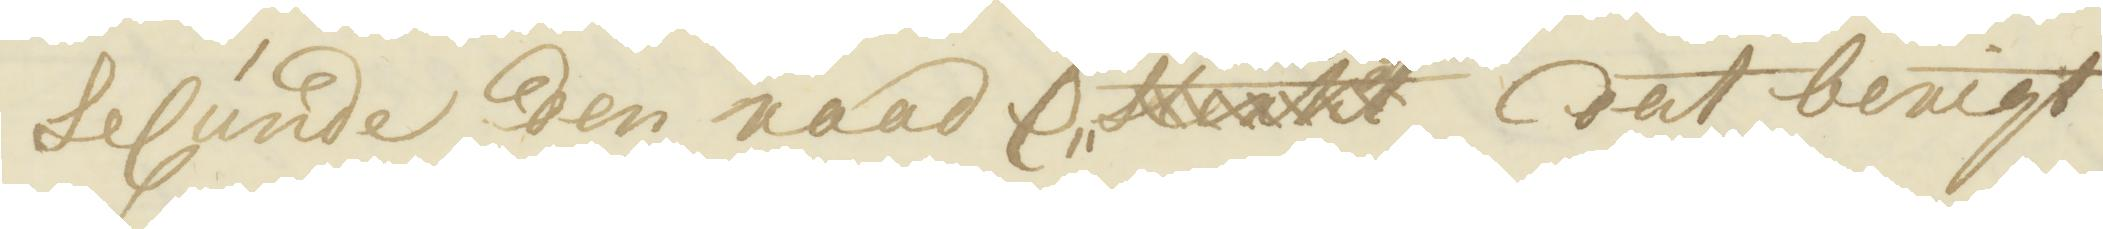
secunde den raad ver„sterkt dat berigt
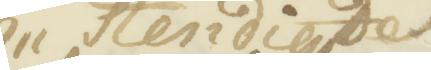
„stendigde
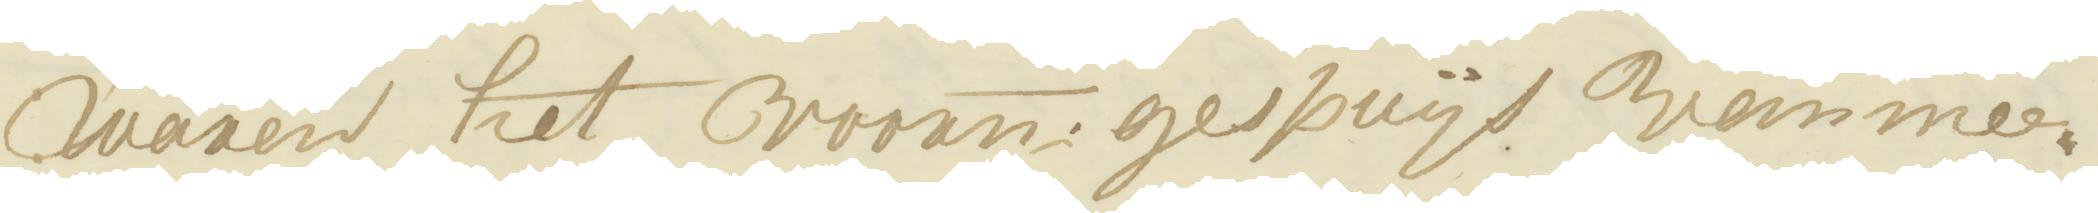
waren het voorn: gespuijs van mee„
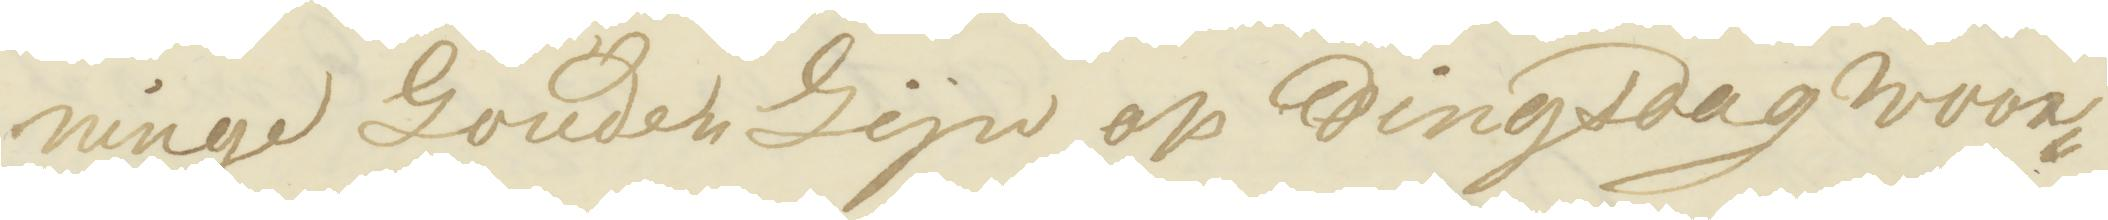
ninge zouden zijn op dingsdag voor„
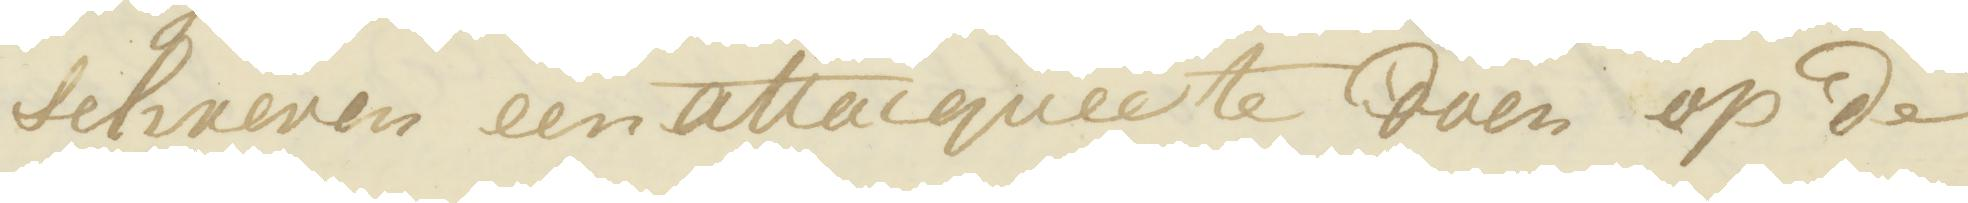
schreven een attacquee te doen op de
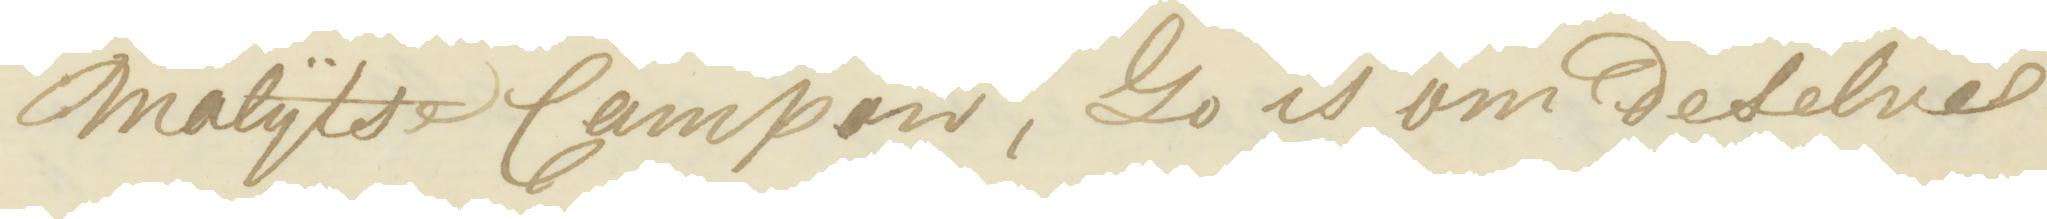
malijtse Campon, zo is om deselve
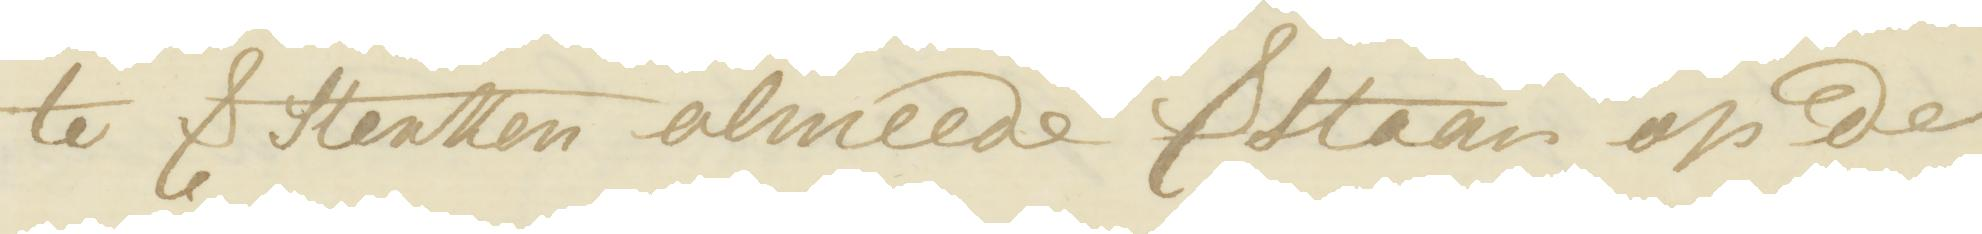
te versterken almeede verstaan op de
